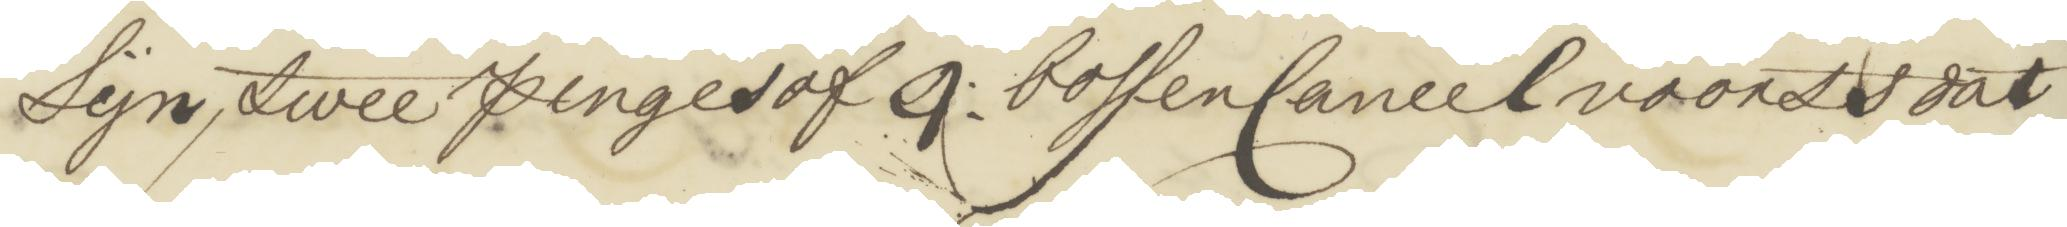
sijn, twee pinges of 4. bossen Caneel voorts dat
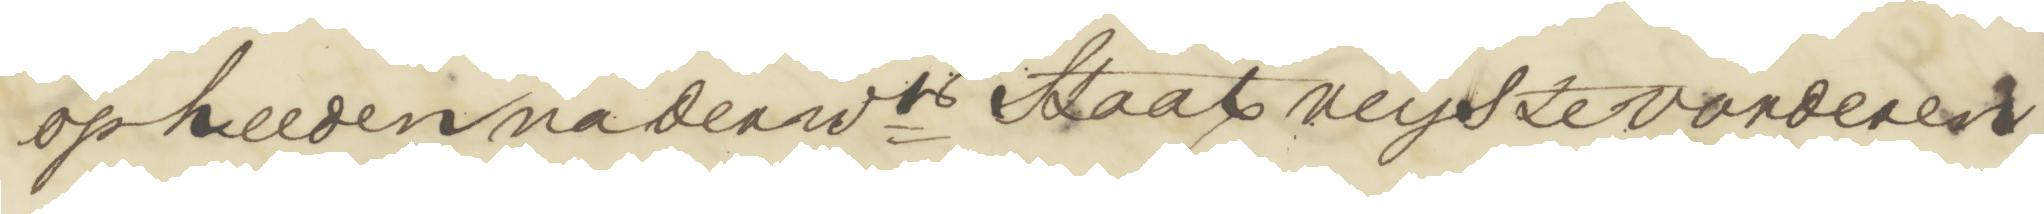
op heeden na der w=ts staat reijs te vorderen
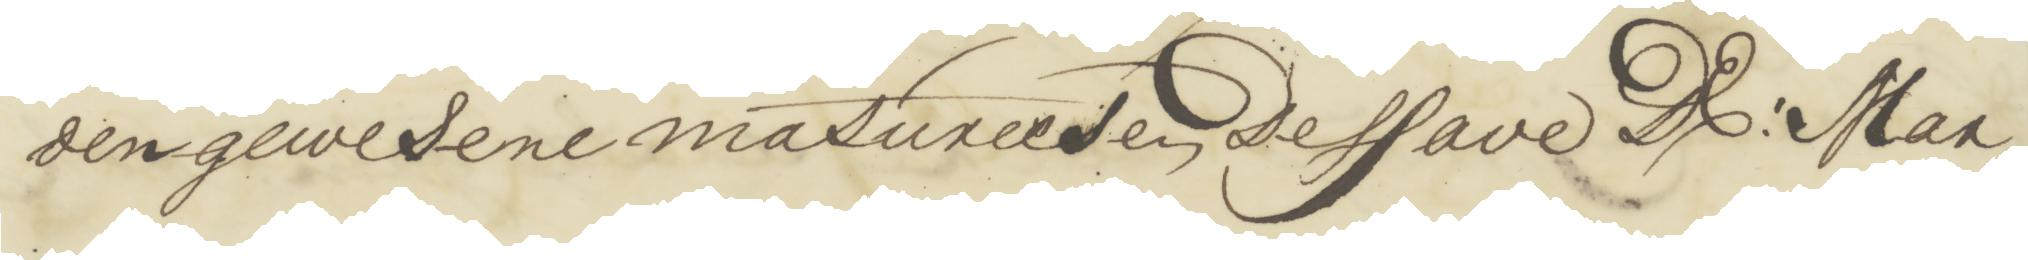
den gewesene matureesen dessave DE: Mar
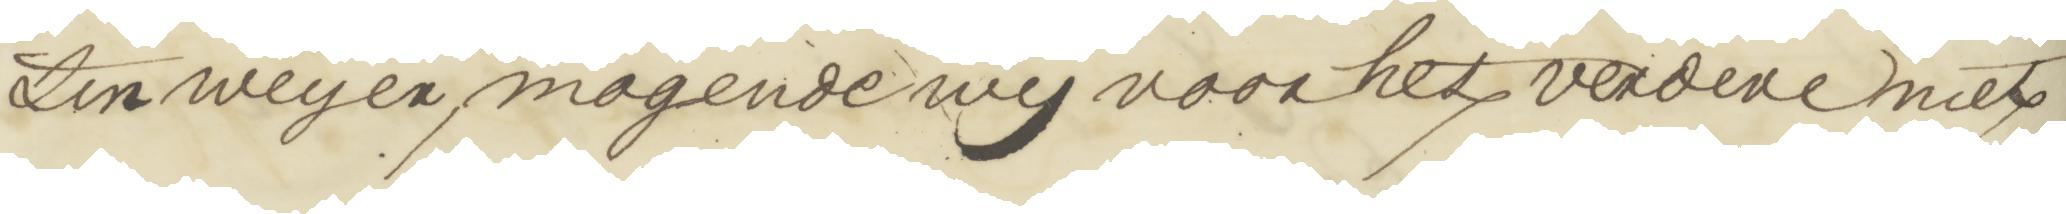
tin weijer, mogende wij voor het verdere niet
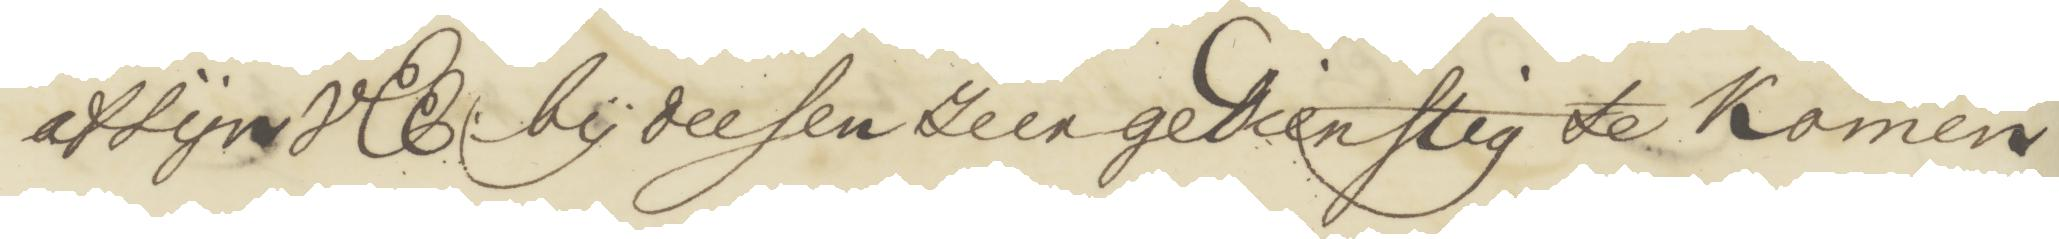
afsijn VEE: bij deesen zeer gedienstig te komen
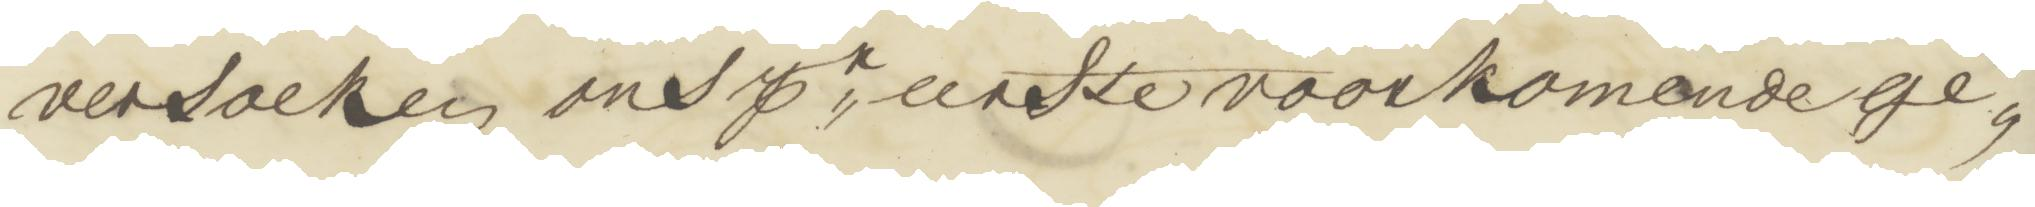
versoeken ons p„r eerste voorkomende ge„
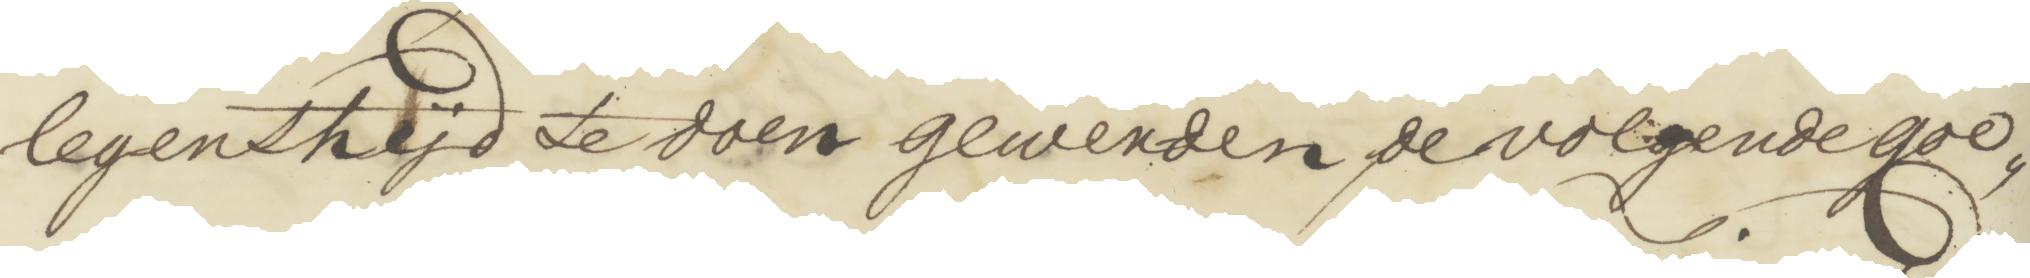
legenthijd te doen gewerden, de volgende goe„
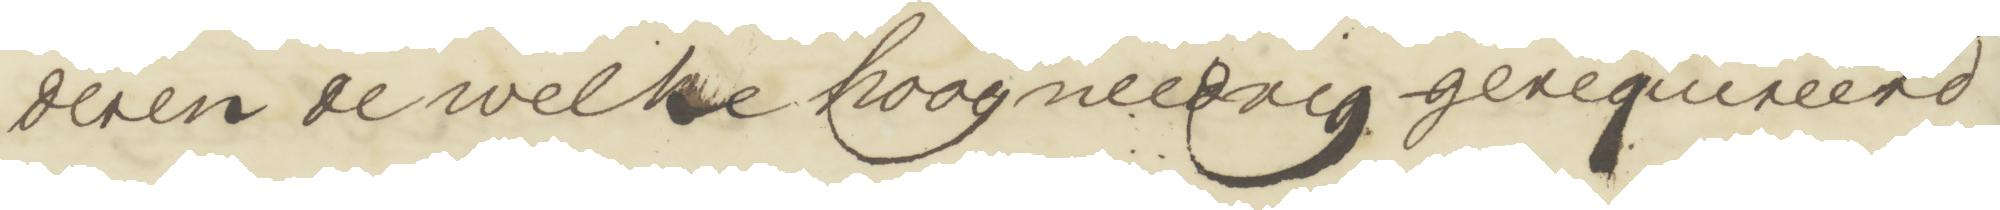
deren de welke hoog needrig gerequireerd
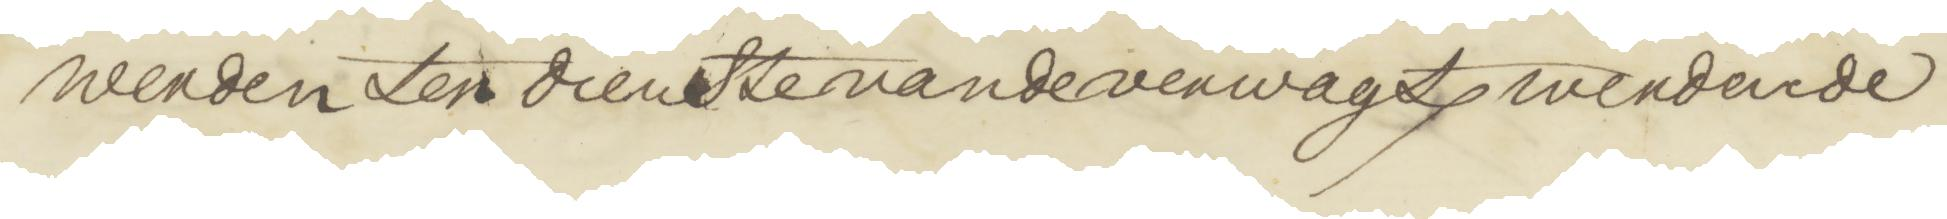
werden ten dienste van de verwagt werdende
